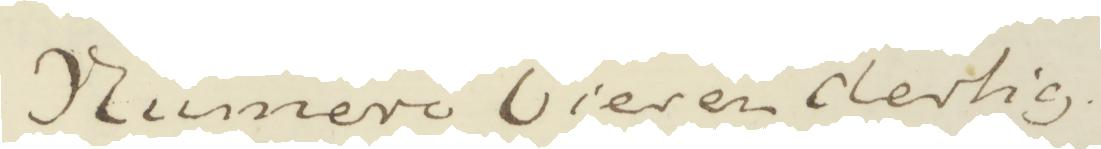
Numero Vier en dertig.
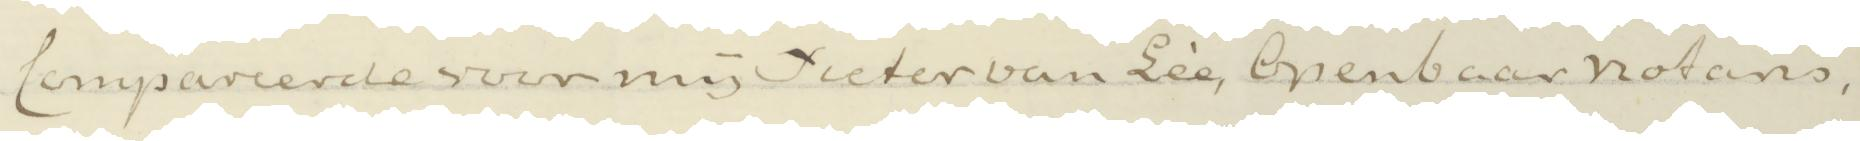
Compareerde voor mij Pieter van Leè, Openbaar notaris,
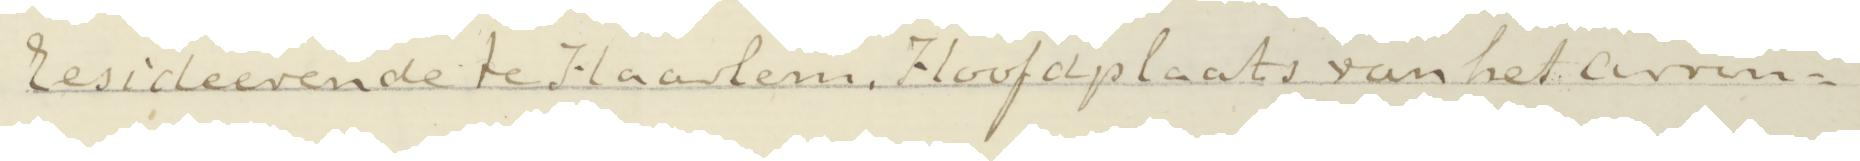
resideerende te Haarlem, Hoofdplaats van het arron=
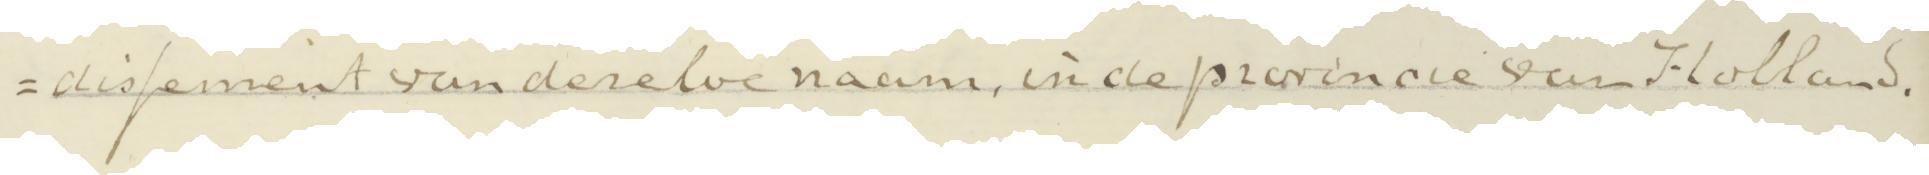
=dissement van dezelve naam, in de provincie van Holland.
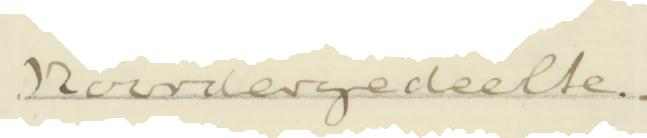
Noordergedeelte.
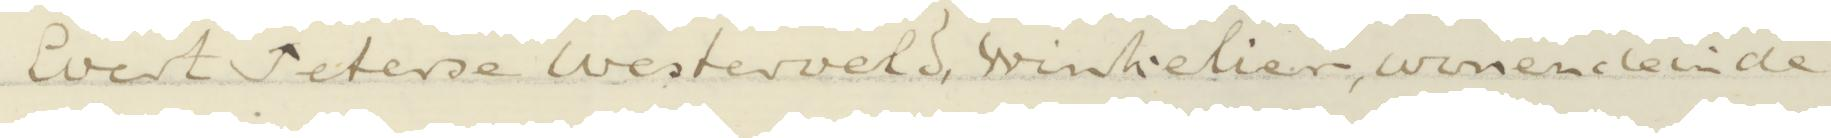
Evert Peterse Westerveld, winkelier, wonende in de
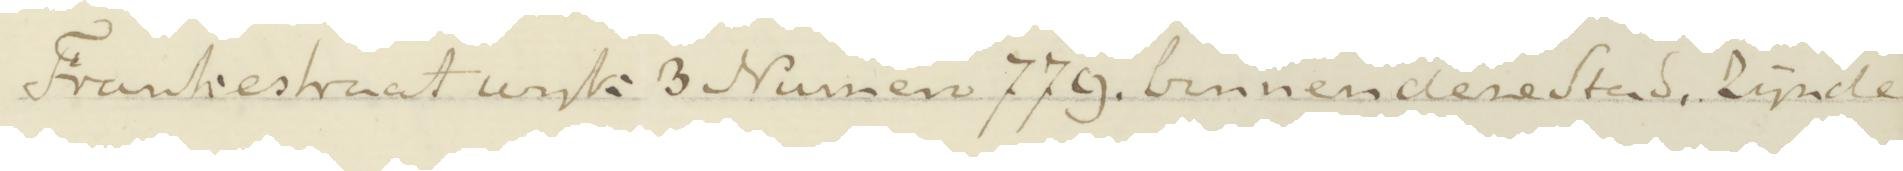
Frankestraat wyk 3 Numero 779. binnen deze stad, zijnde
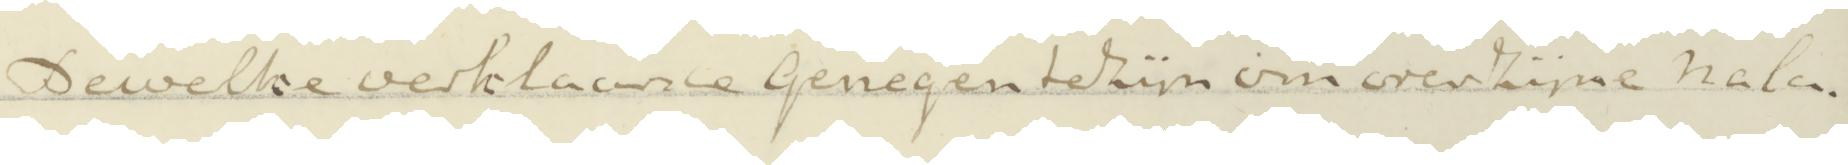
Dewelke verklaarde genegen te zijn om over zijne nale.
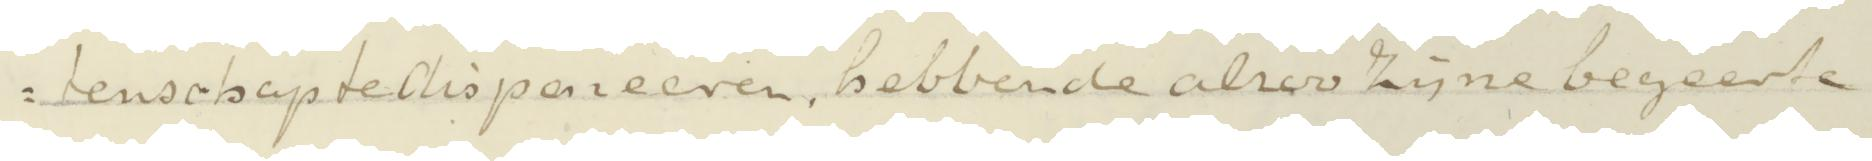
=tenschap te disponeeren, hebbende alzoo zijne begeerte
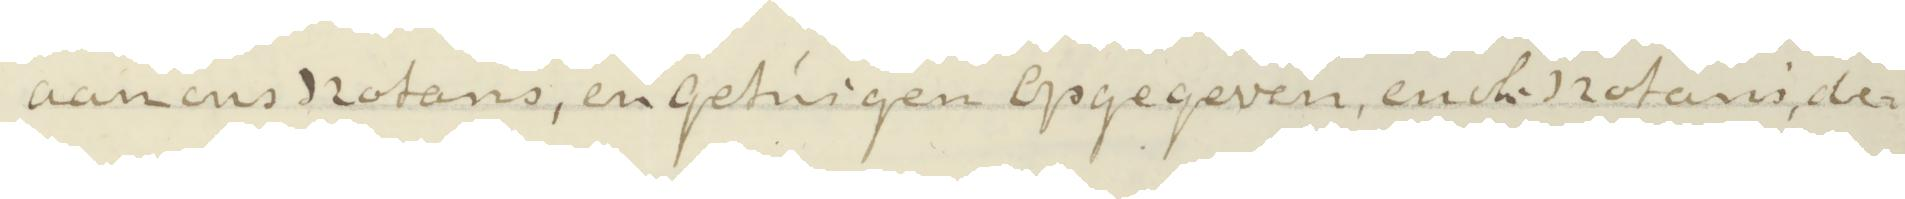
aan ons Notaris, en getuigen opgegeven, en ik notaris, de=
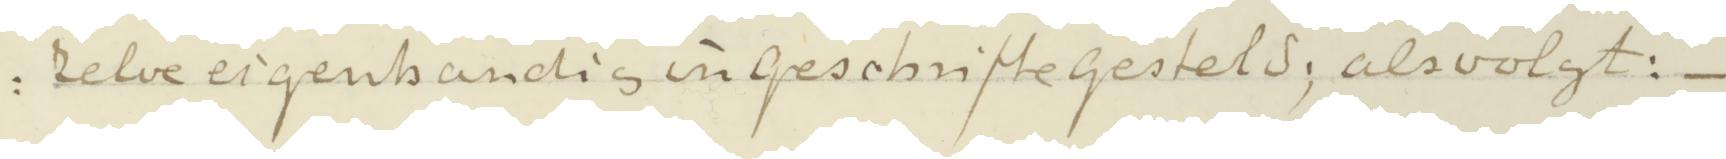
=zelve eigenhandig in geschrifte gesteld; als volgt:
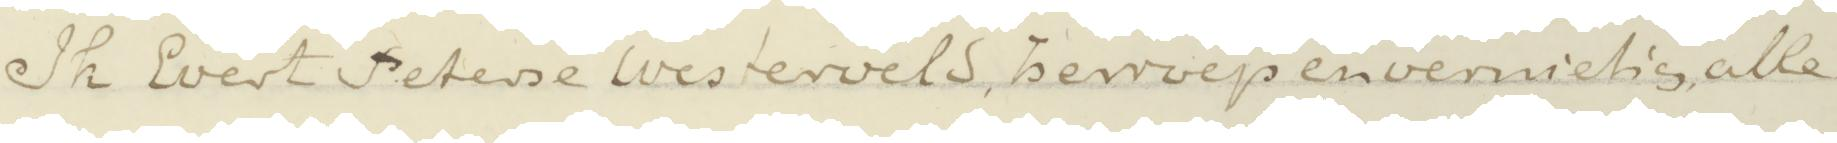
Jk Evert Peterse Westerveld, herroep en vernietig alle
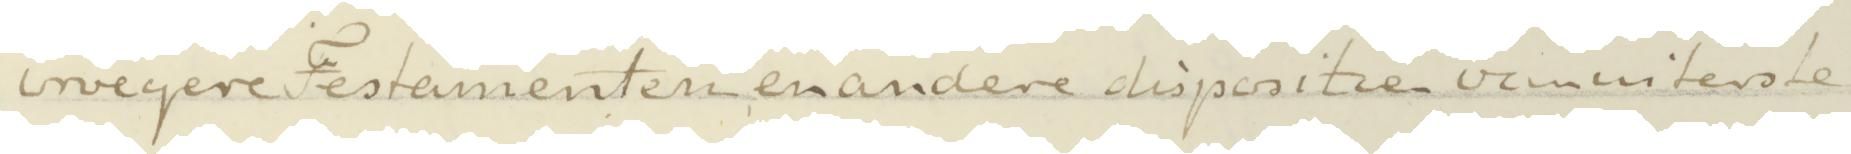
vroegere Testamenten, en andere dispositien van uiterste
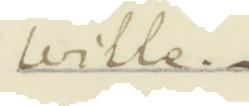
wille.
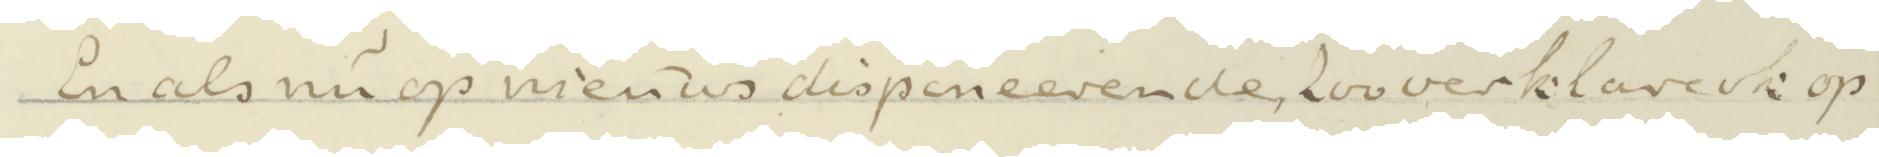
En als nu op nieuws disponeerende, zoo verklare ik op
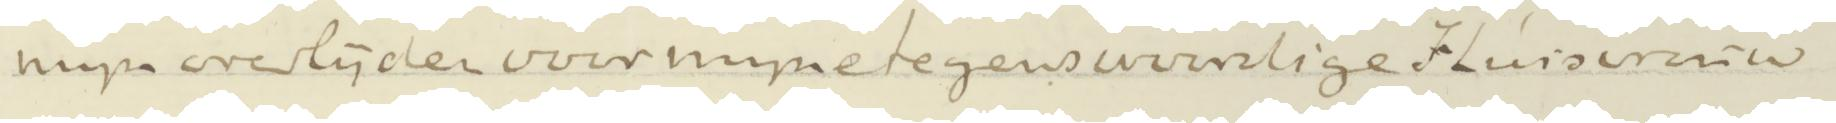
mijn overlijden voor myne tegenswoordige Huisvrouw
